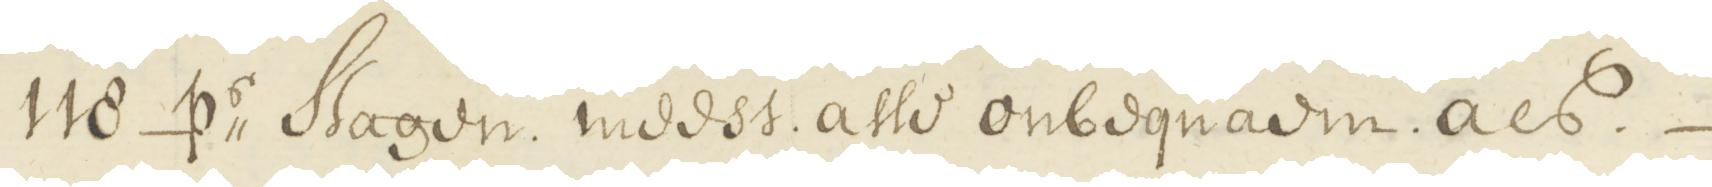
118 p„s stagen. meest alle onbequaem. als.
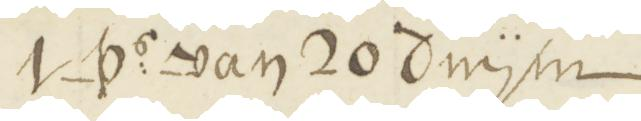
1 p:s van 20 duijm
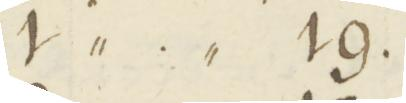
1 „ . „ 19.
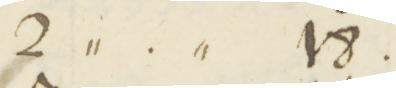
2 „ . „ 18.
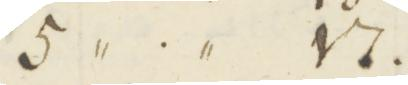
5 „ . „ 17.
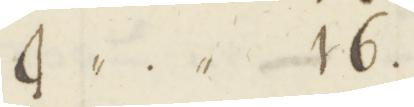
4 „ . „ 16.
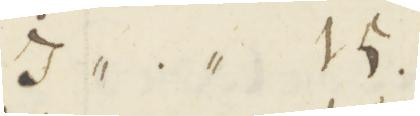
7 „ . „ 15.
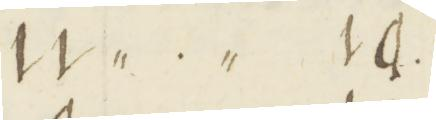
11 „ . „ 14.
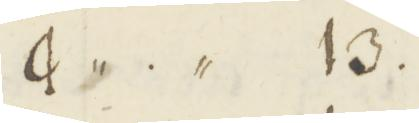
4 „ . „ 13.
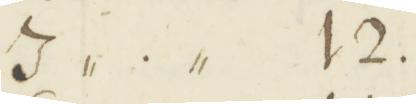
7 „ . „ 12.
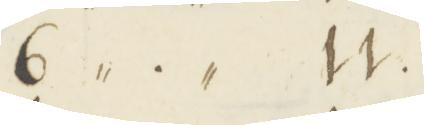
6 „ . „ 11.
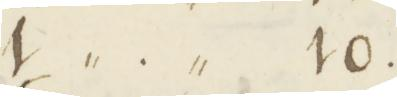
1 „ . „ 10.
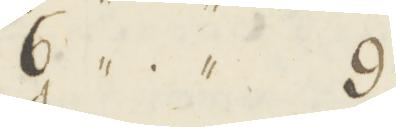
6 „ . „ 9.
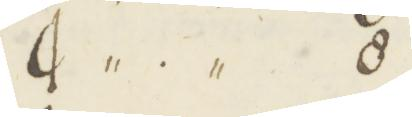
4 „ . „ 8.
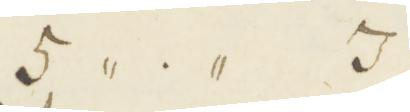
5 „ . „ 7.
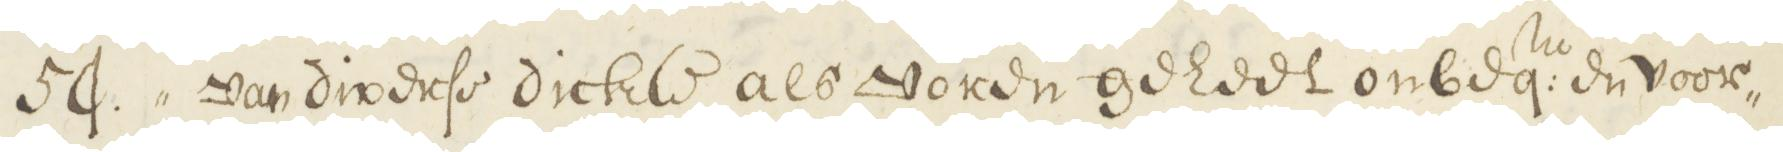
54: „ van diverse dickte als voren geheel on beq:m en voor„
